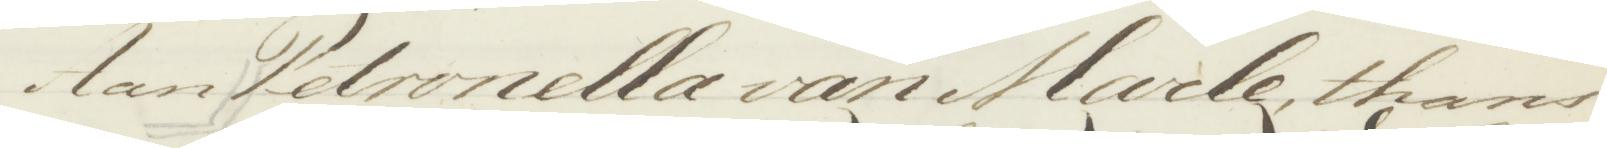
Aan Petronella van Marle, thans
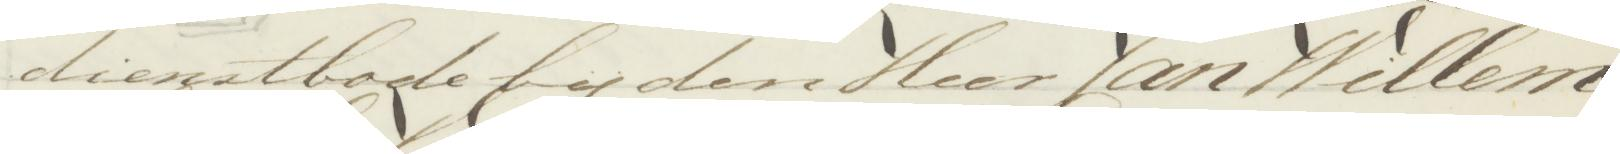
dienstbode bij den Heer Jan Willem
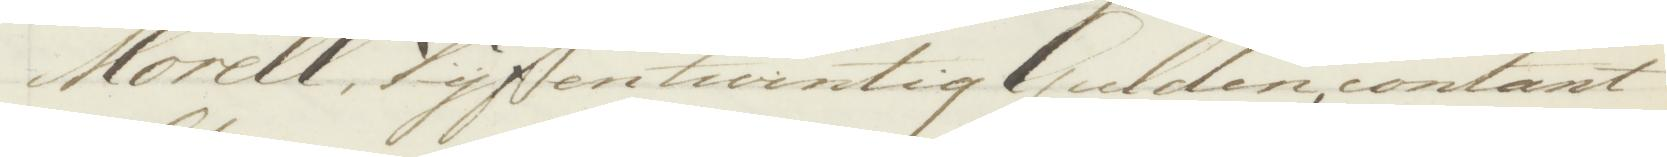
Morell, vijf en twintig Gulden, contant
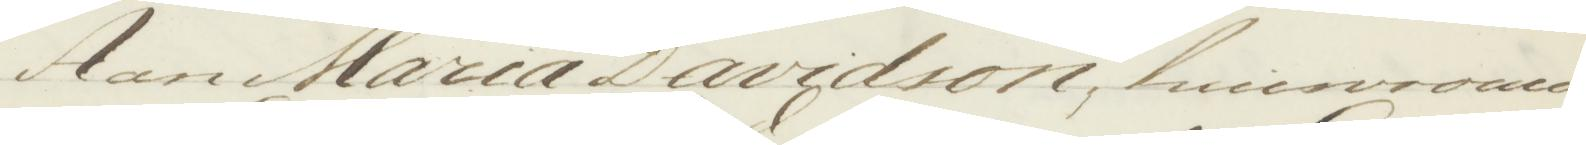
Aan Maria Davidson, huisvrouw
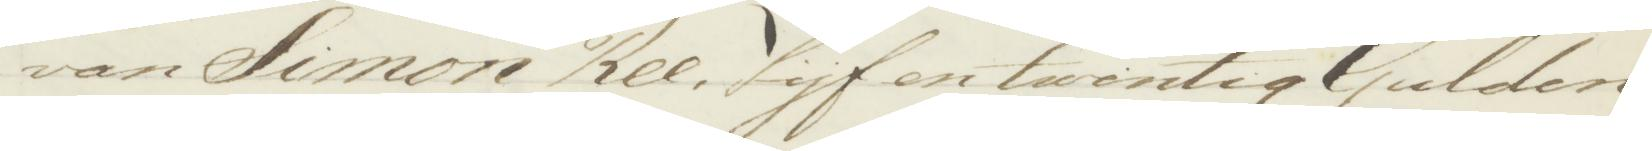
van Simon Ree, Vijf en twintig Gulden
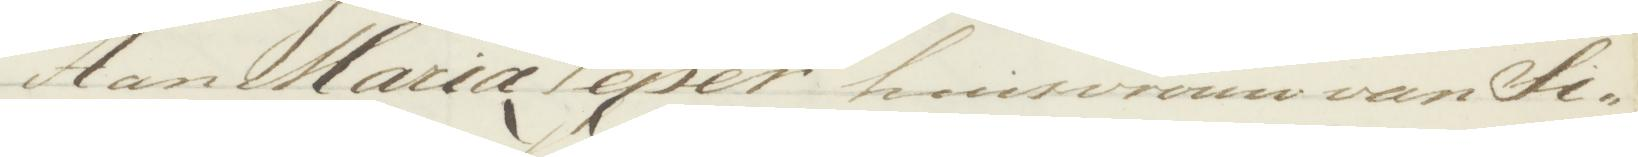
Aan Maria Peper huisvrouw van Si„
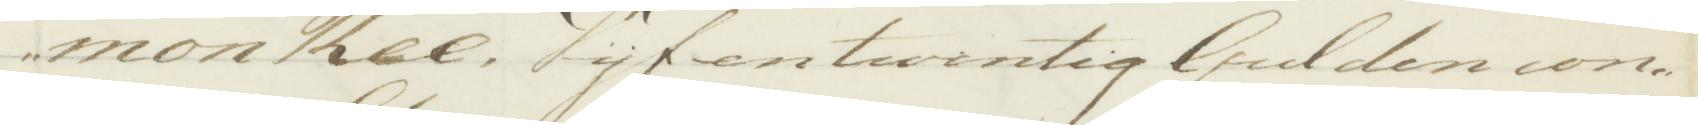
„mon Ree, vijf en twintig Gulden con„
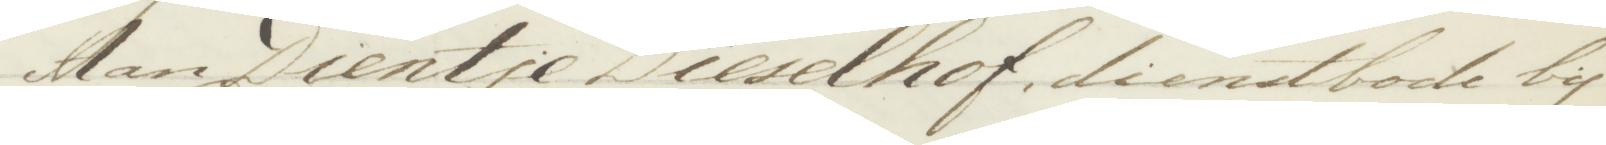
Aan Dientje Dieselhof, dienstbode bij
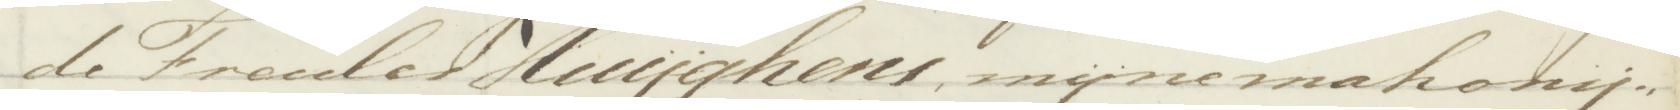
de Freules Huijghens, mijne mahonij„
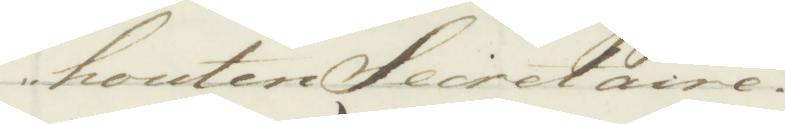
„houten Secretaire
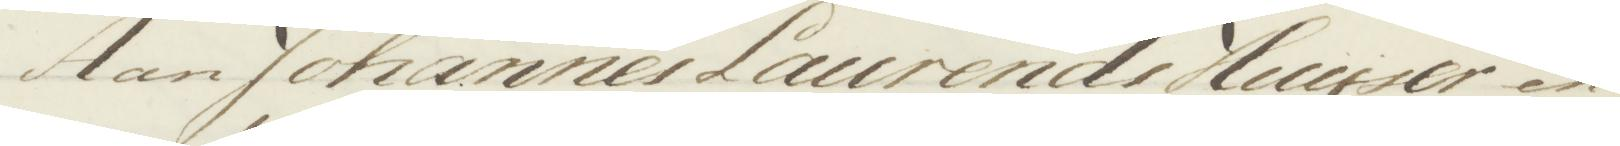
Aan Johannes Laurends Huijser en
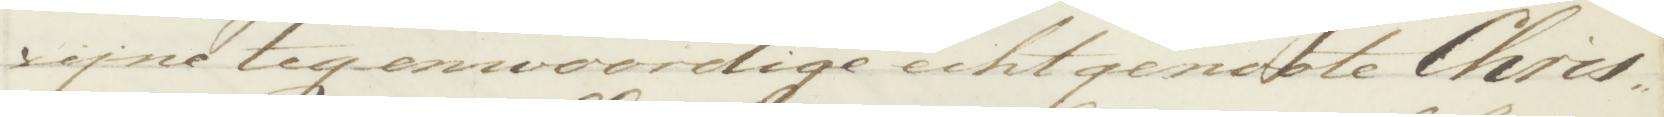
zijne tegenwoordige echtgenoote Chris„
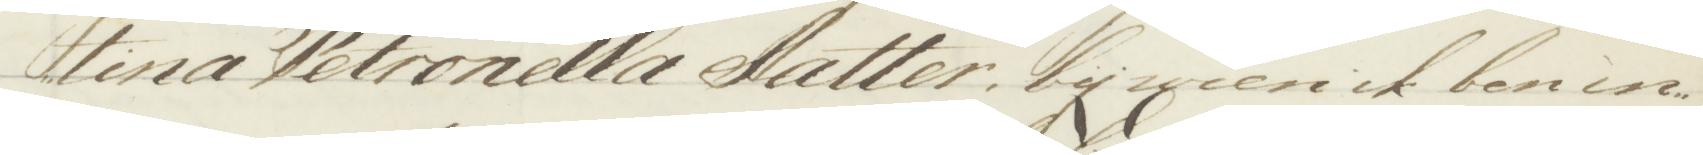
tina Petronella Satter, bij wien ik ben in„
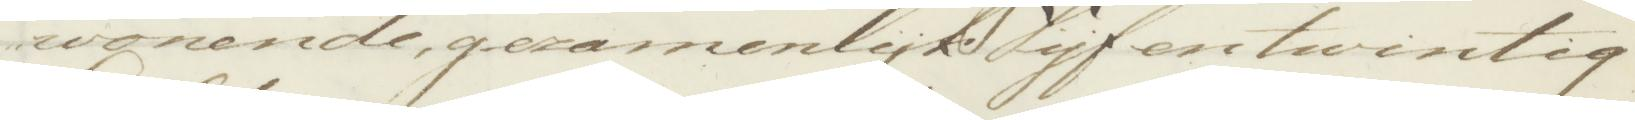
wonende, gezamenlijk Vijf en twintig
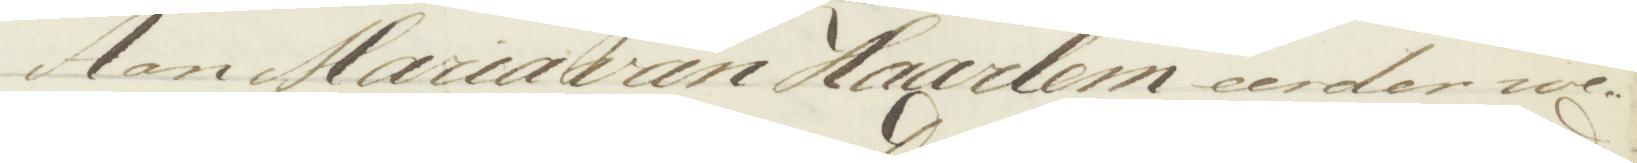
Aan Maria van Haarlem eerder we„
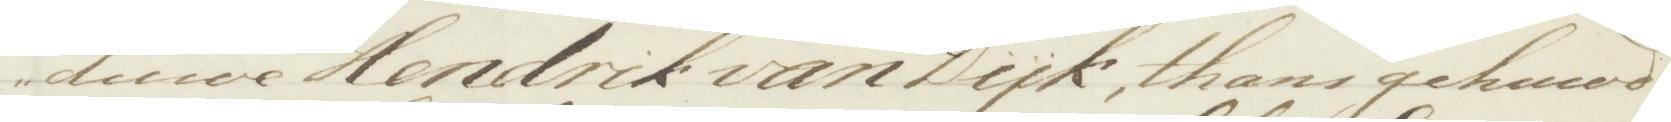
„duwe Hendrik van Dijk, thans gehuwd
